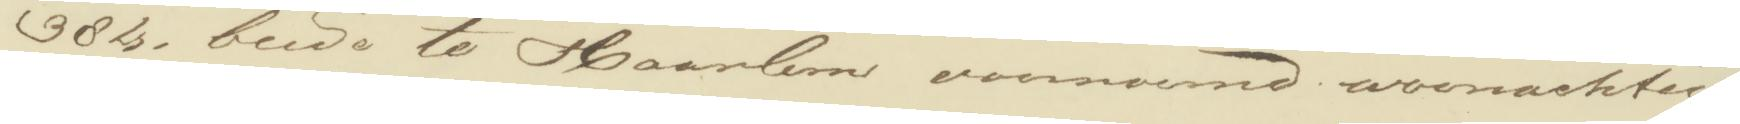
384. beide te Haarlem voornoemd woonachtig,
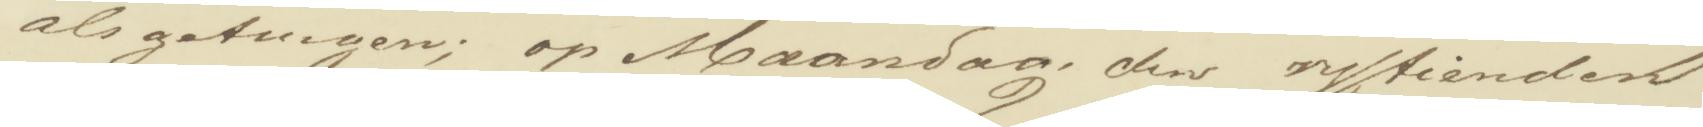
als getuigen; op Maandag, den vyftienden
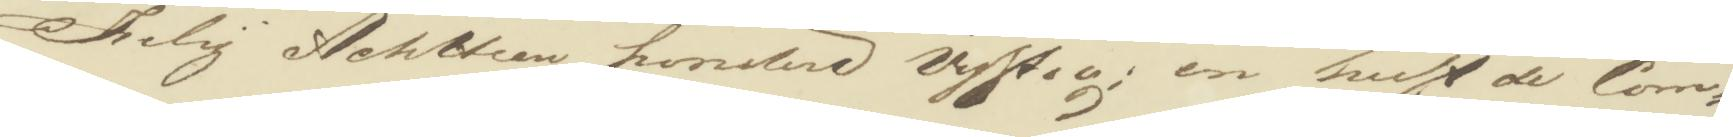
Iuly Achttien honderd vyftig; en heeft de Com„
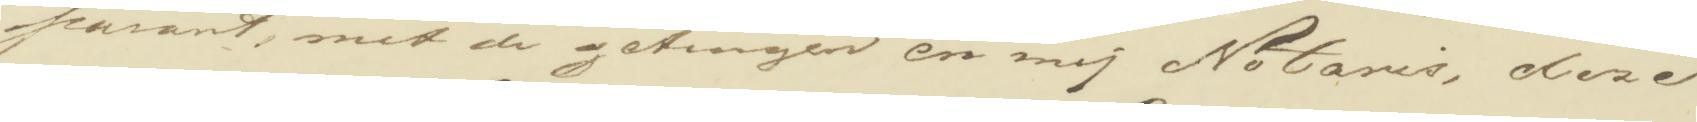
„parant, met de getuigen en mij Notaris, deze
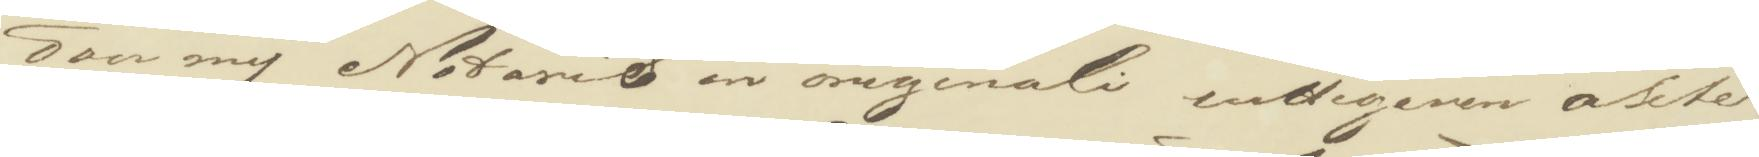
door my Notaris in originali uittegeven akte
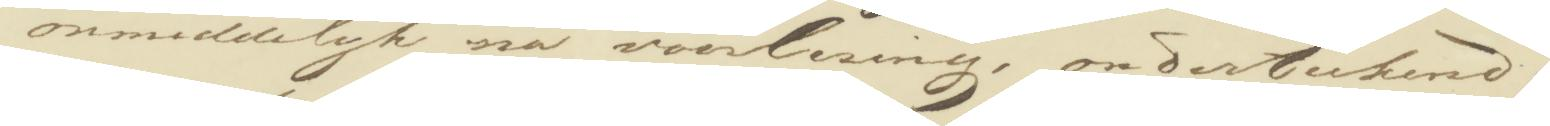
onmiddelyk na voorlezing, onderteekend
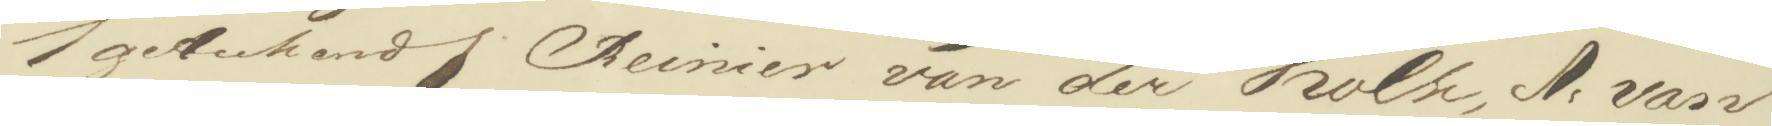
/geteekend/ Reinier van der Kolk, A: van
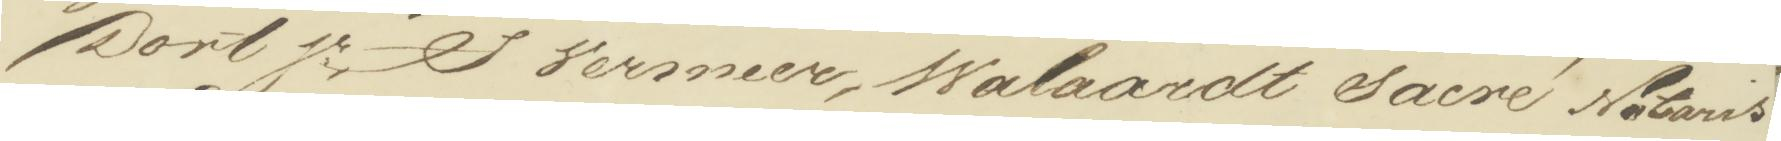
Dort J=r, I Vermeer, Walaardt Sacré Notaris
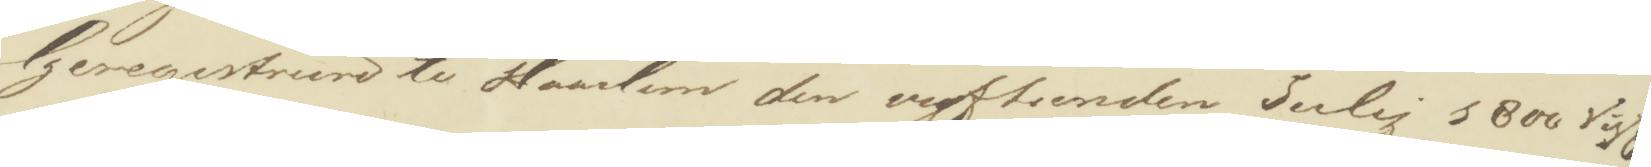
Geregistreerd te Haarlem den vyftienden Iuly 1800 Vijf
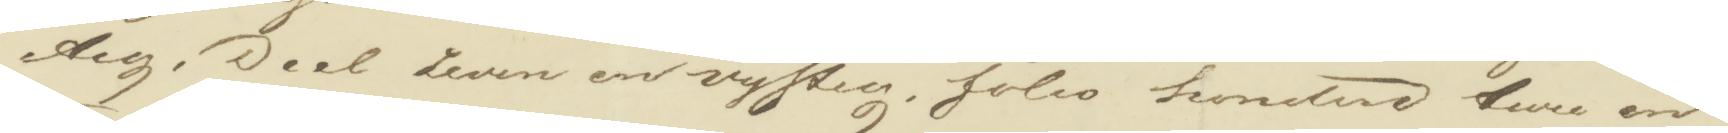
„tig, Deel zeven en vyftig, folio honderd twee en
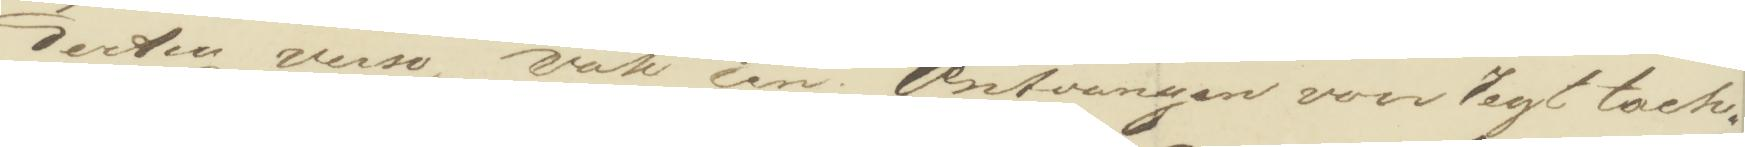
dertig verso, vak Een, Ontvangen voor regt tach„
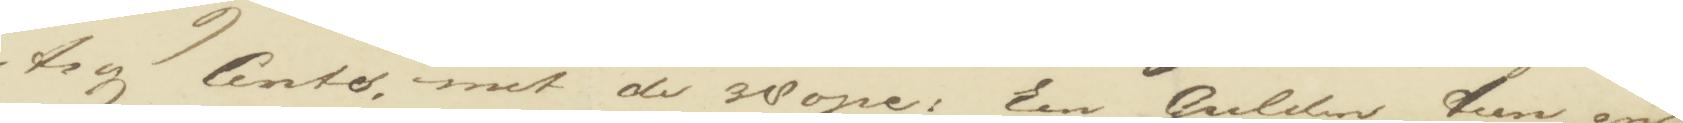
tig Cents, met de 38 opc: Een Gulden tien en
